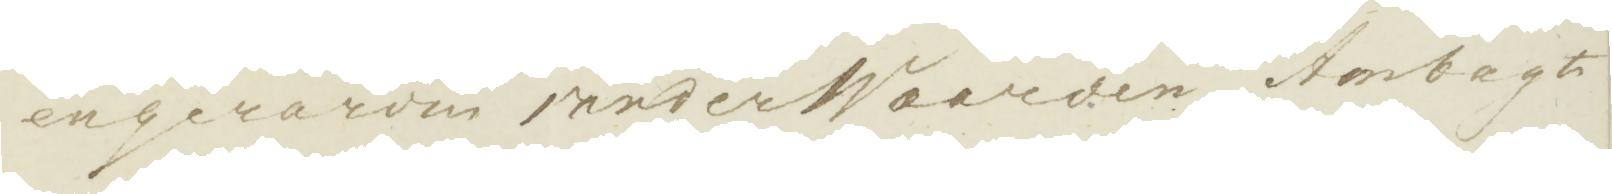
en gerardus van der Waarden, Ambagts
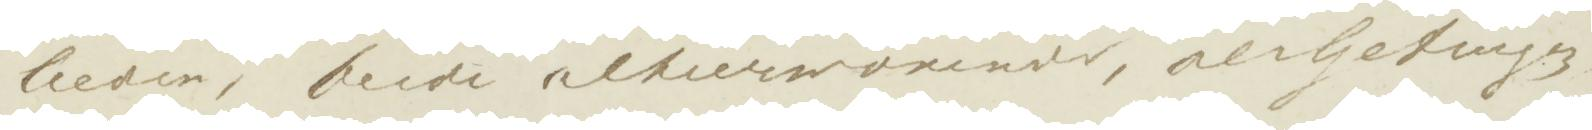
lieden, beide alhier wonende, als Getuigen
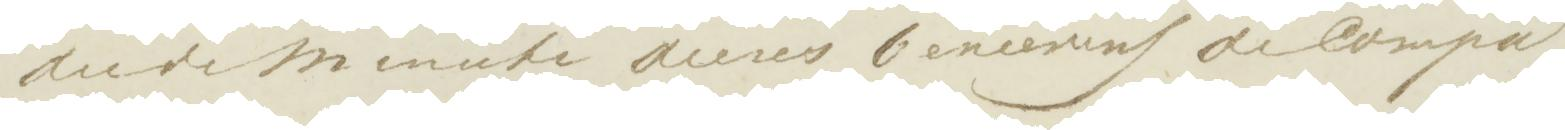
die de minute deezes beneevens de compa
